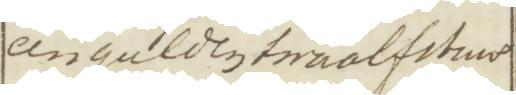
een gulden twaalf stuivr
